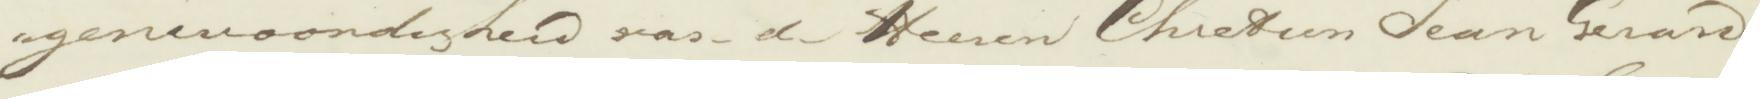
„genwoordigheid van de Heeren Chretien Iean Gerard
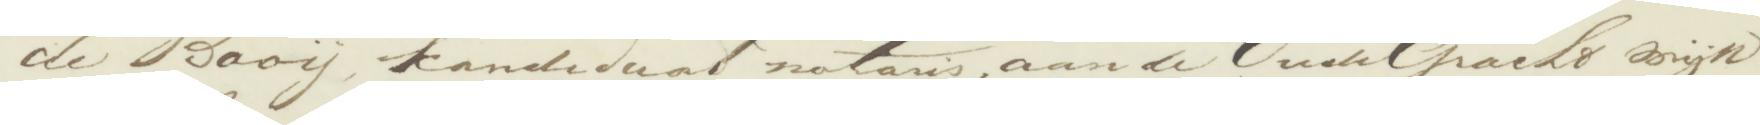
de Kooij, kandidaat notaris, aan de Oude Gracht wijk
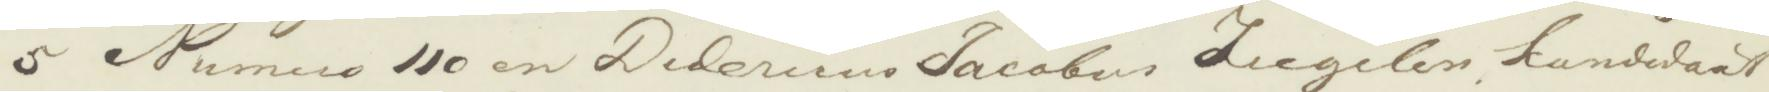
5 Numero 110 en Didericus Iacobus Ziegelen, kandidaat
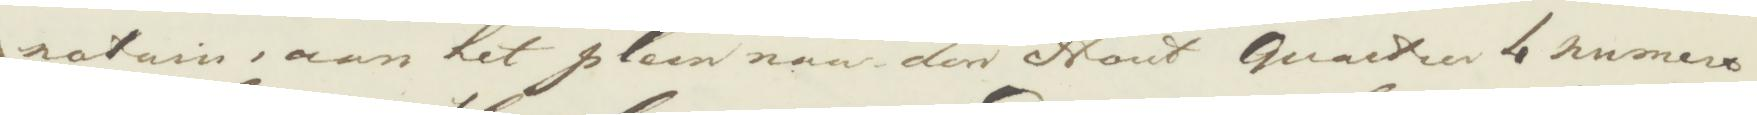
notaris, aan het plein naar den Hout quartier 4 numero
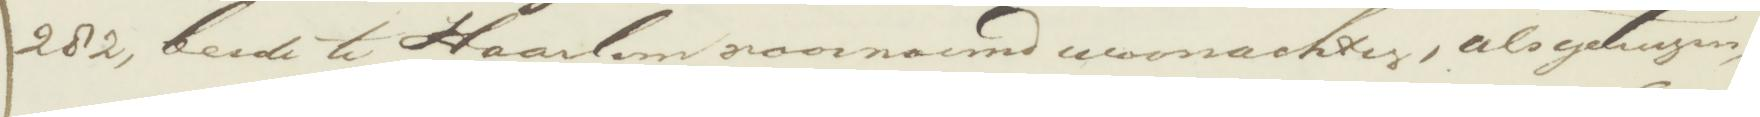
282, beide te Haarlem voornoemd woonachtig, als getuigen
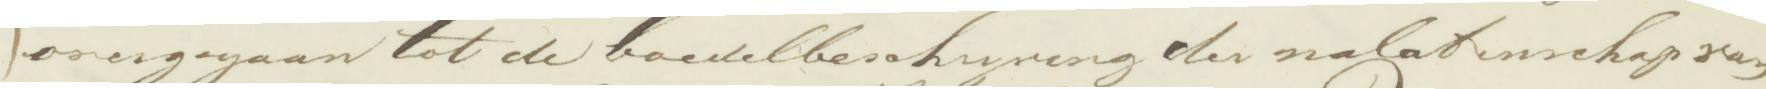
overgegaan tot de boedelbeschryving der nalatenschap van
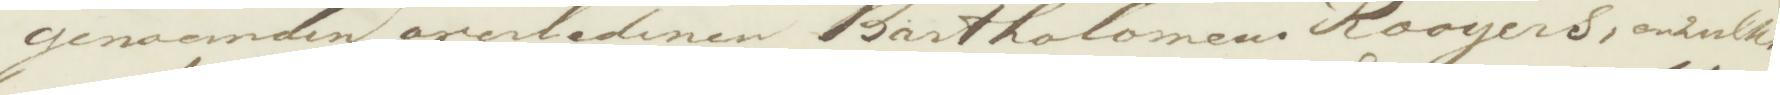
genoemden overledenen Bartholomeus Rooyers, en zulks
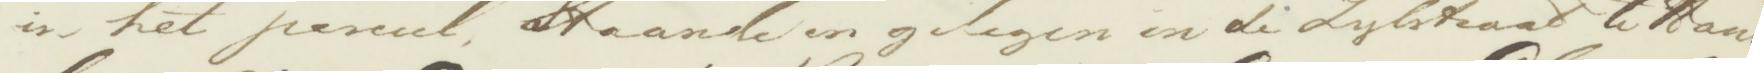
in het perceel, staande en gelegen in de Zylstraat te Haar
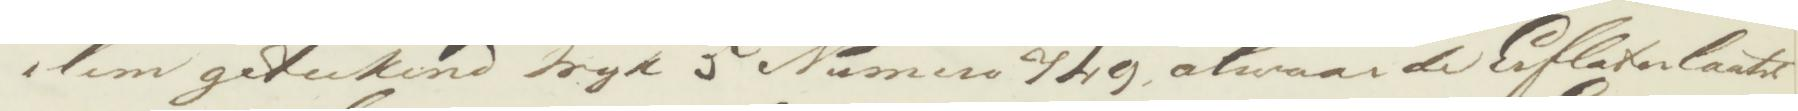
„lem geteekend wyk 5 Numero 749, alwaar de Erflater laatst
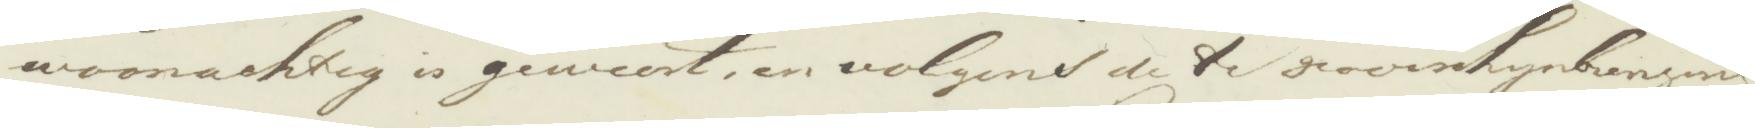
woonachtig is geweest, en volgens de te voorschynbrenging
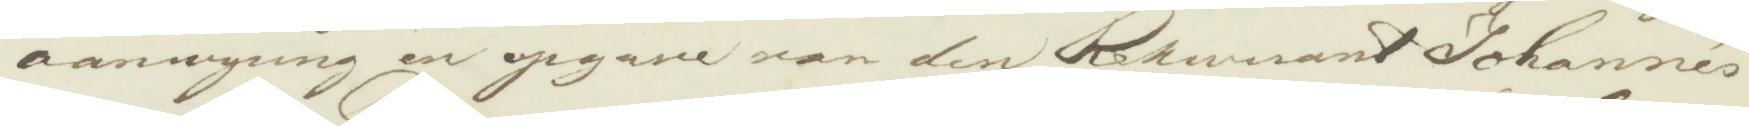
aanwyzing en opgave van den Rekwirant Iohannes
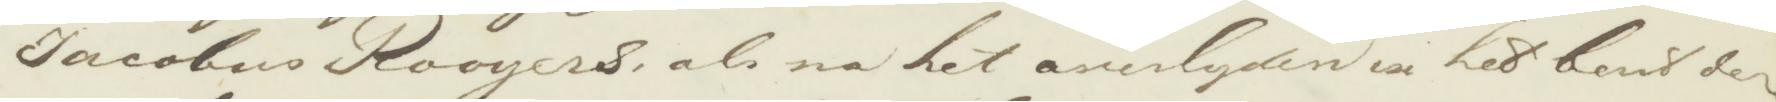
Iacobus Rooyers, als na het overlyden in het bezit der
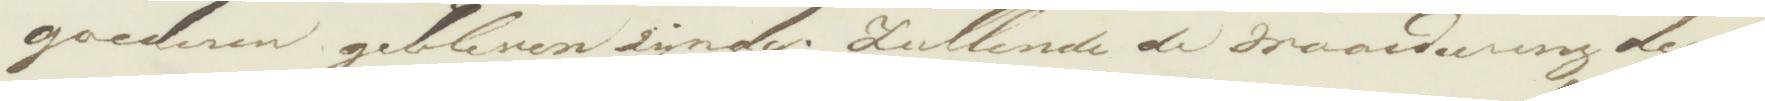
goederen gebleven zijnde, zullende de waardeering der
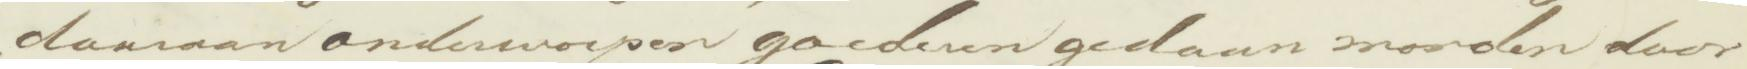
daaraan onderworpen goederen gedaan worden door
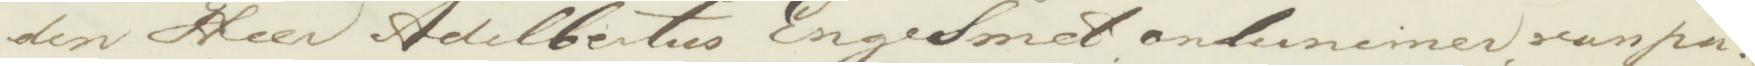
den Heer Adelbertus Engesmet ondernemer, van pu.
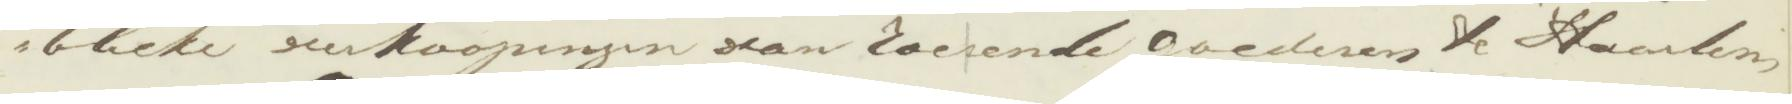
„blieke verkoopingen van roerende goederen te Haarlem
